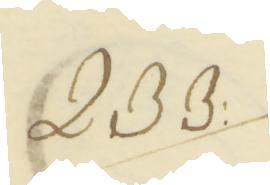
233:
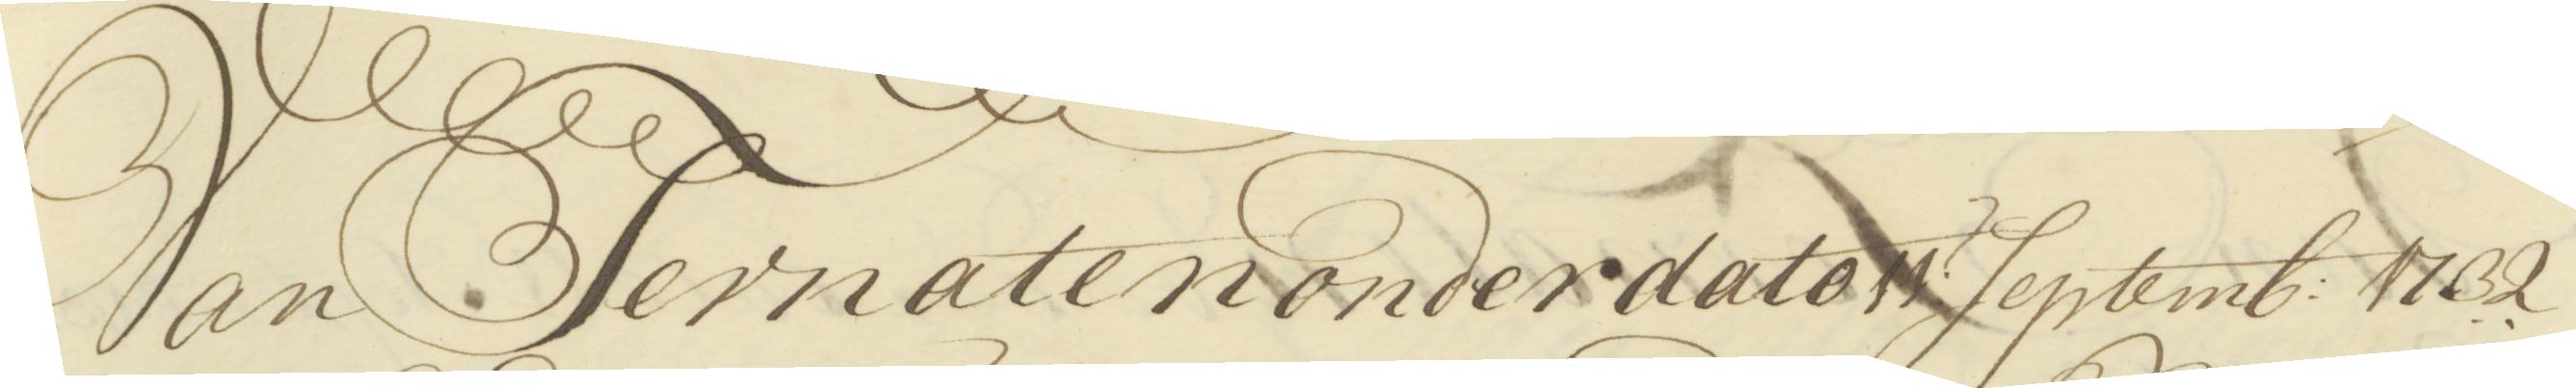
Van Ternaten onder dato 11:' Septemb: 1732
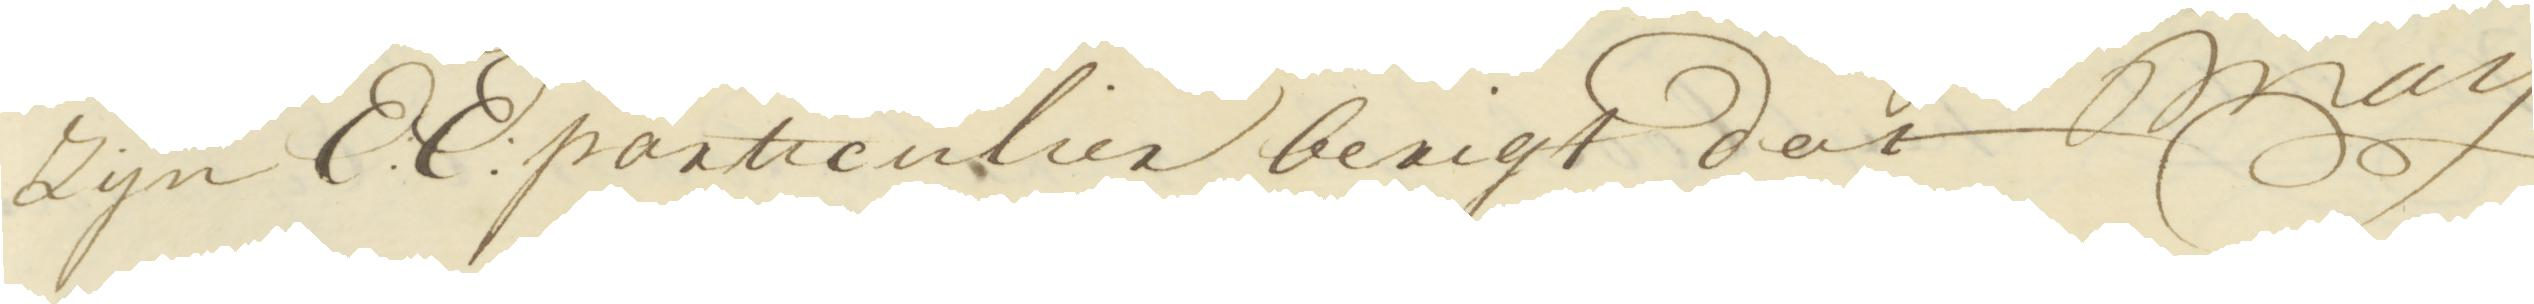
zijn E:E: particulier berigt dat Maij
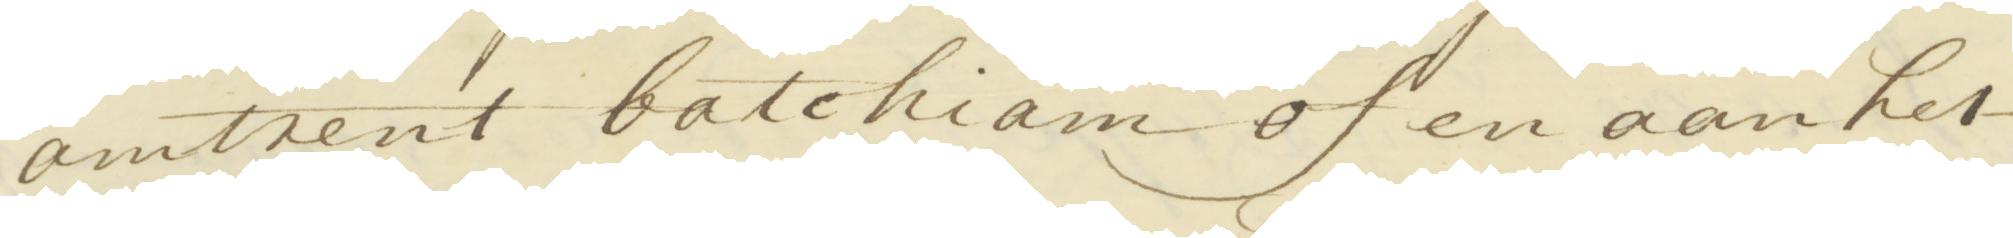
omtrent batchiam of en aan het
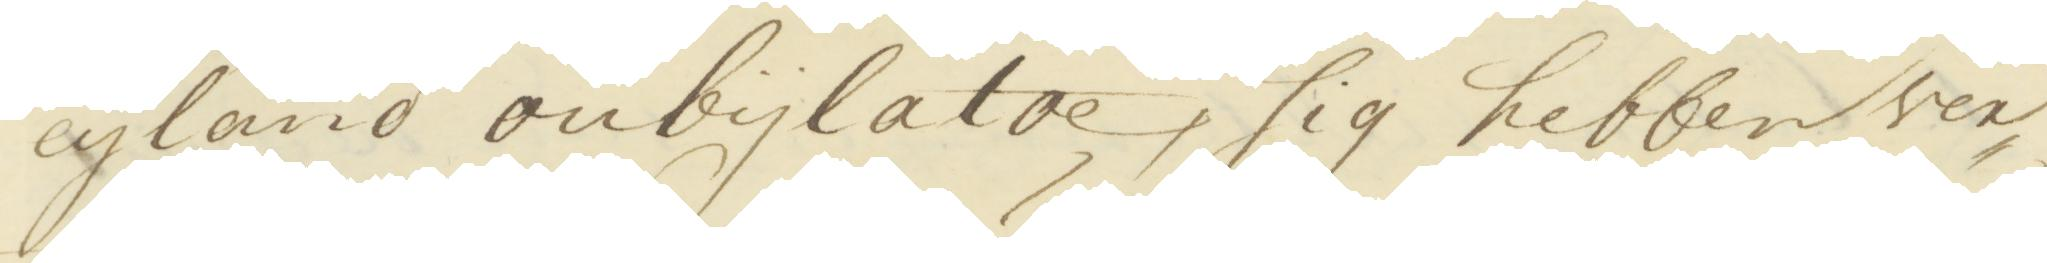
eijland oubijlatoe, sig hebben ver„
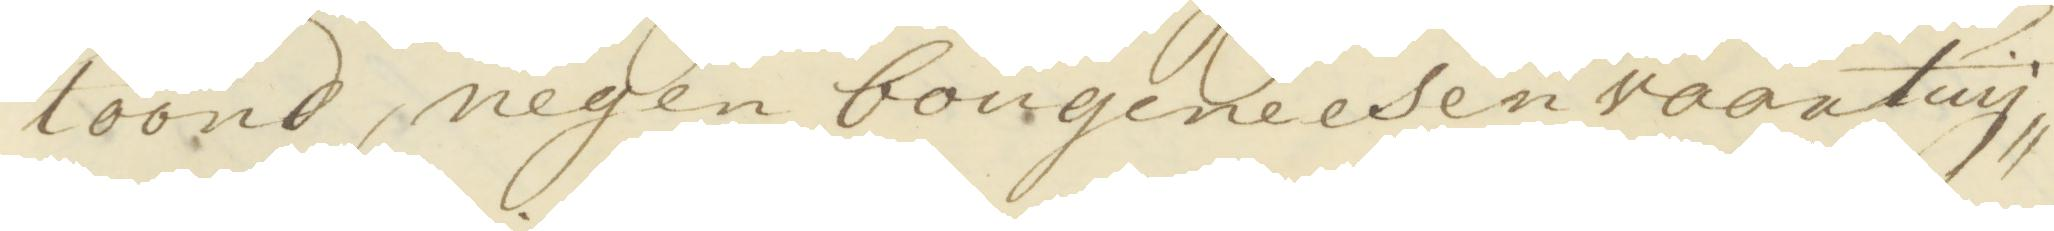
toond, negen bougeneesen voortuij„
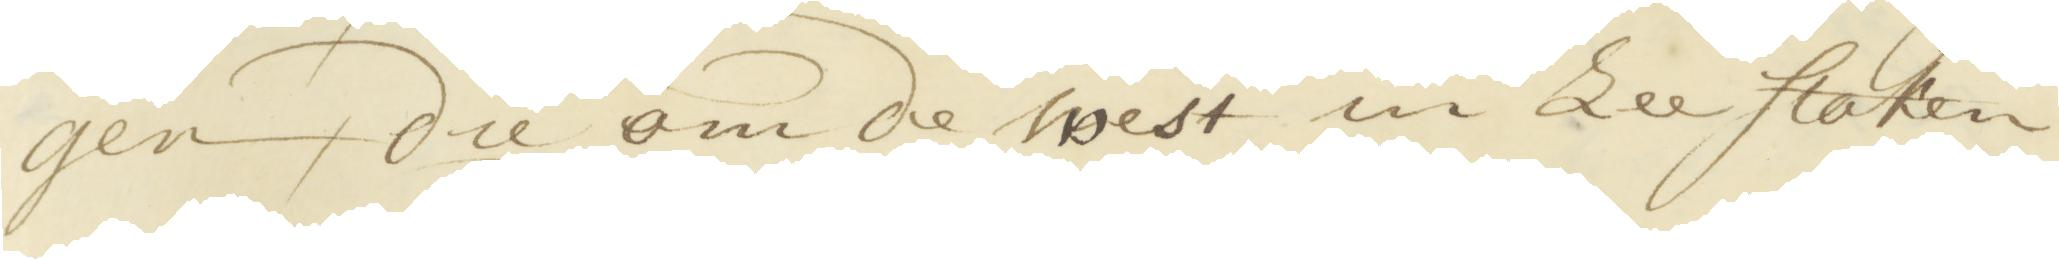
gen, die om de west in Zee staken
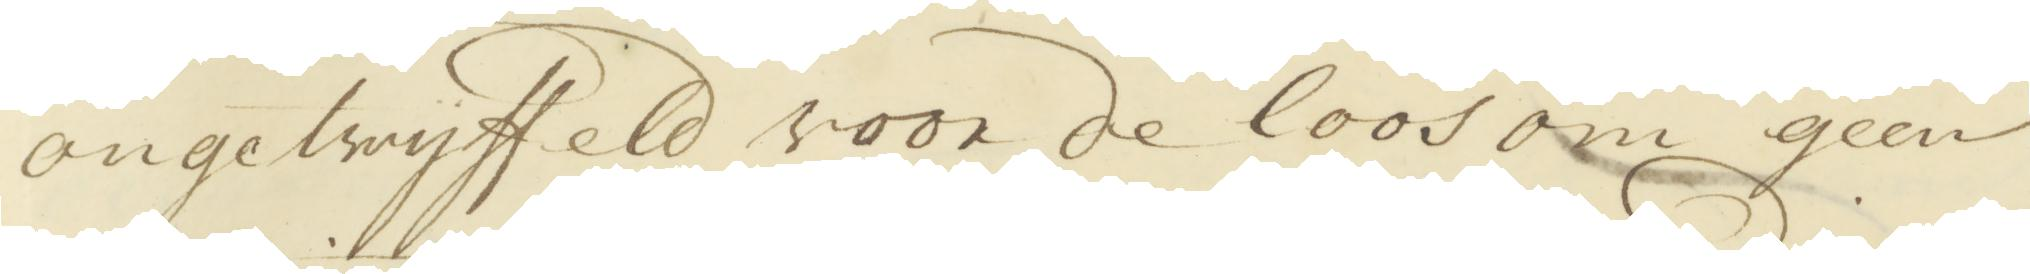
ongetwijffeld voor de loos om geen
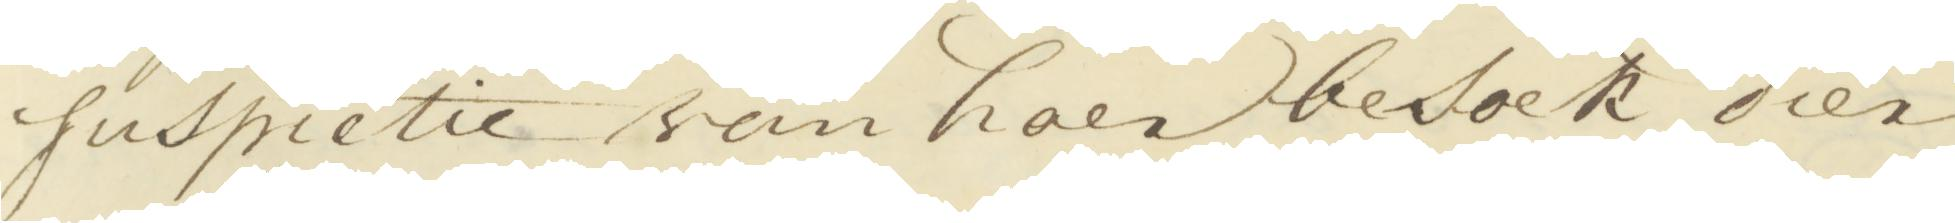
suspietie van haer besoek dier
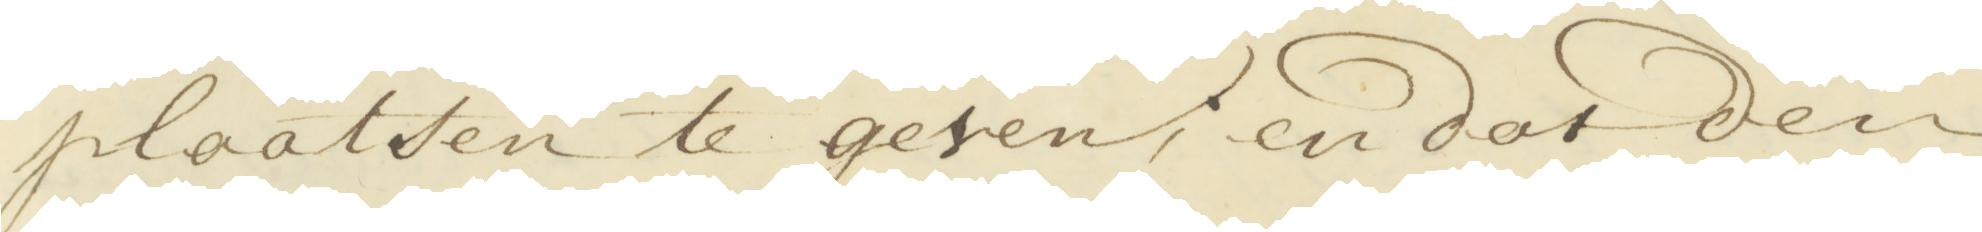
plaatsen te geven; en dat den
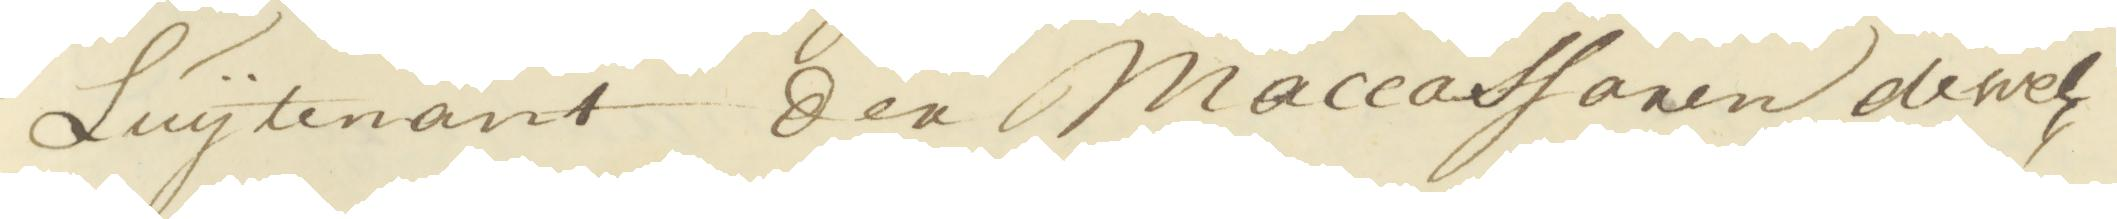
Luijtenant der Maccassaren dewel
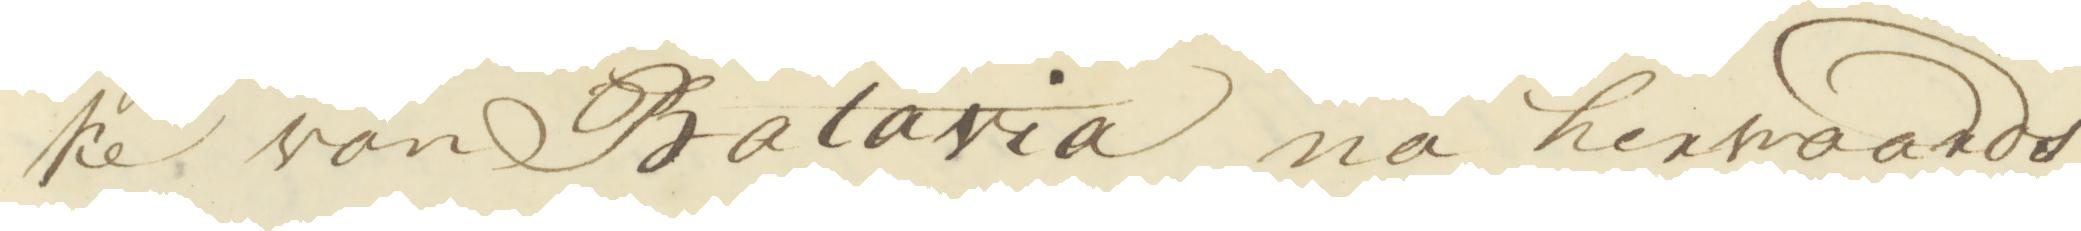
ke van Batavia na herwaards
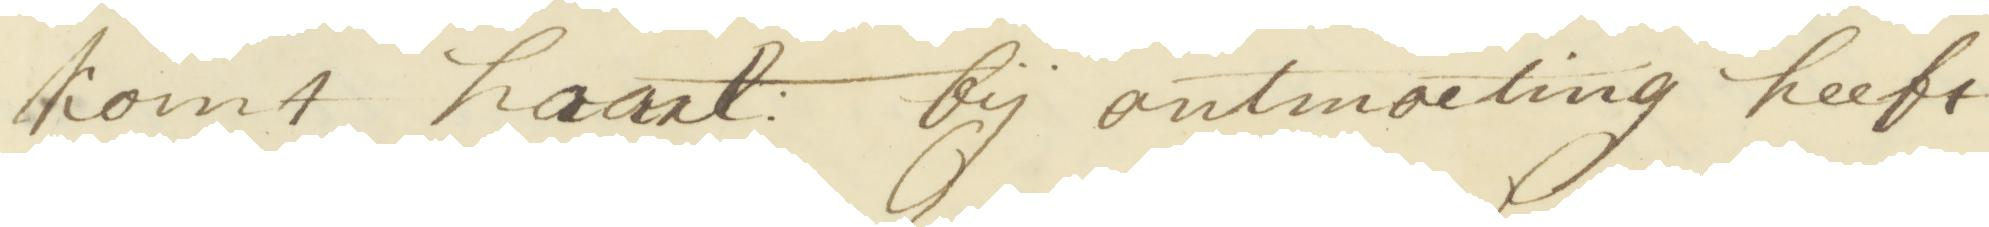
komt haarl: bij ontmoeting heeft
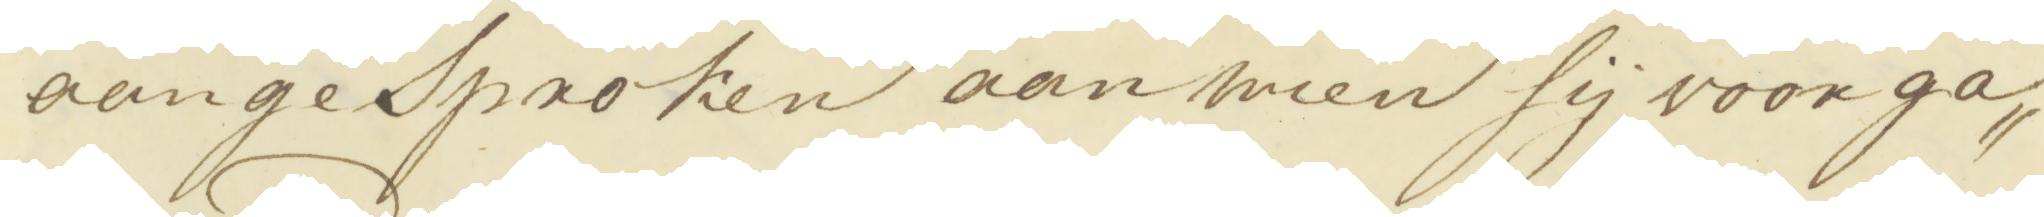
aangesproken aan wien sij voor ga„
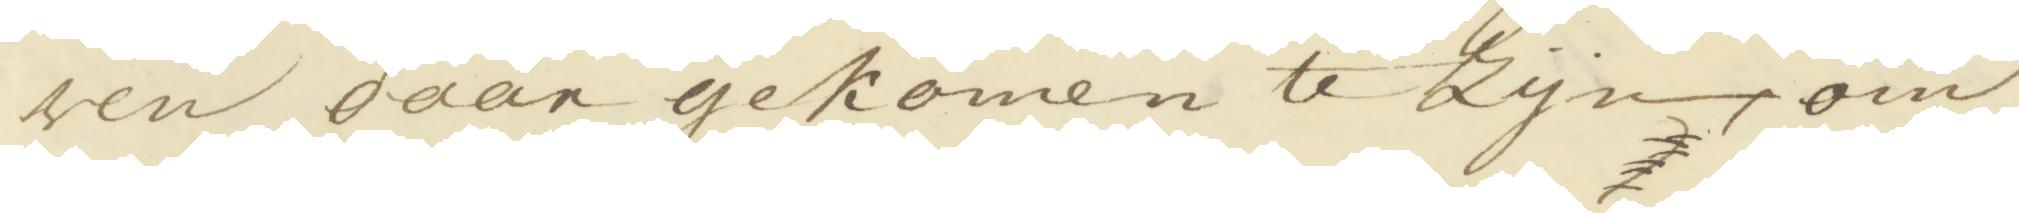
ven daar gekomen te Zijn, om
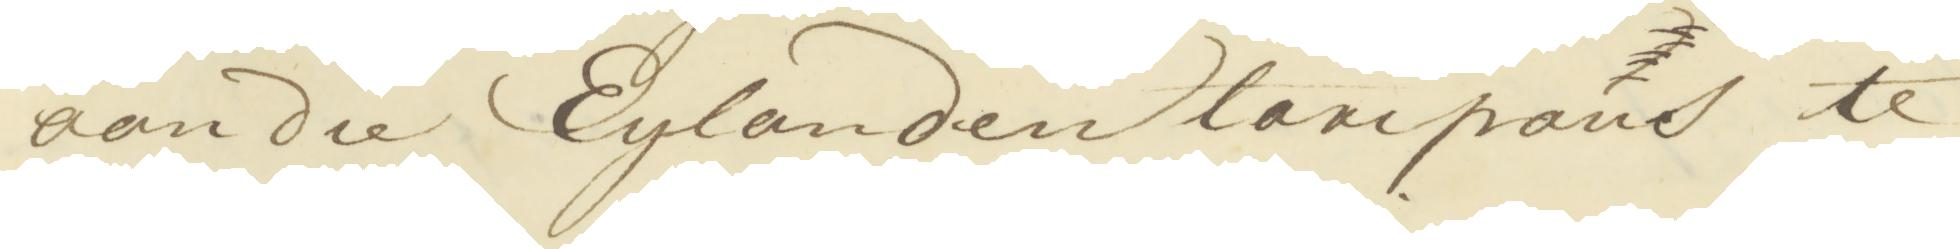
aan die Eylanden laripans te
